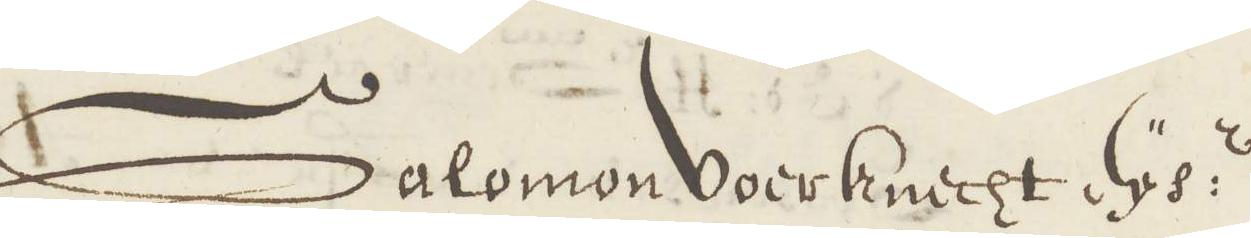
Salomon Voer knecht eijs:r
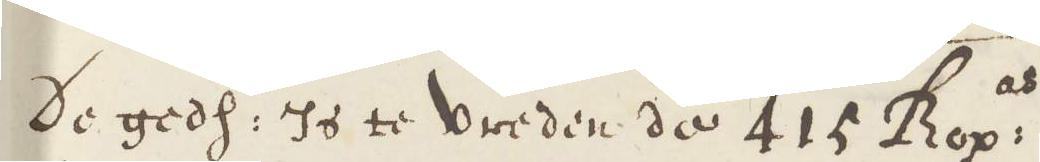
de gedh:e Is te vreden de 415 Rop:as
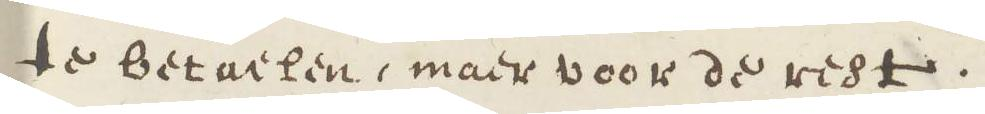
te betaelen, maer voor de rest.
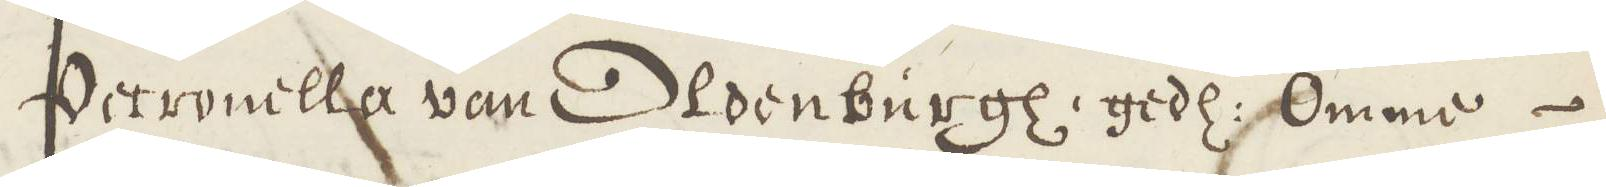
Petronella van Oldenburgh, gedh:e Omme —
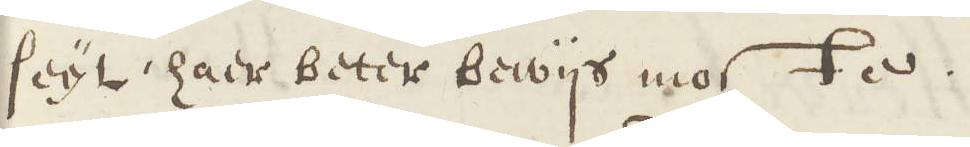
seijt, haer beter bewijs moste.
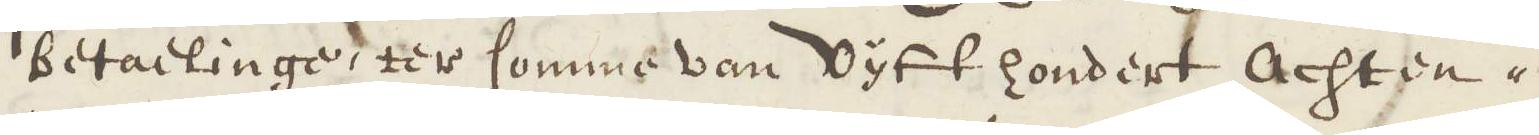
betaelinge, ter somme van vijff hondert achten„
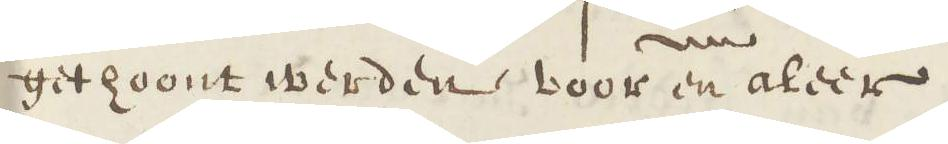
gethoont werden voor en aleer
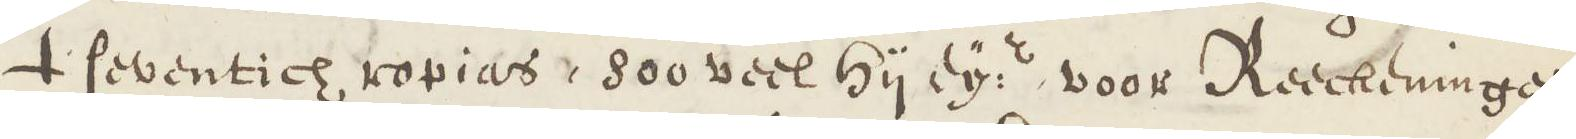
t seventich ropias, soo veel hij eij:r, voor Reeckeninge.
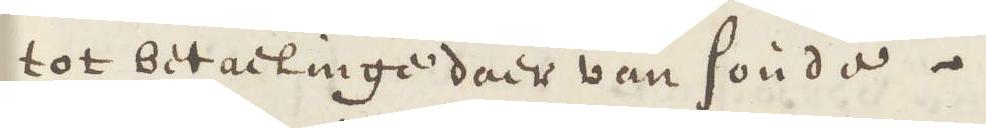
tot betaelinge daer van soude –
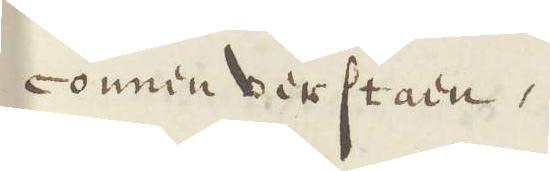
connen verstaen,
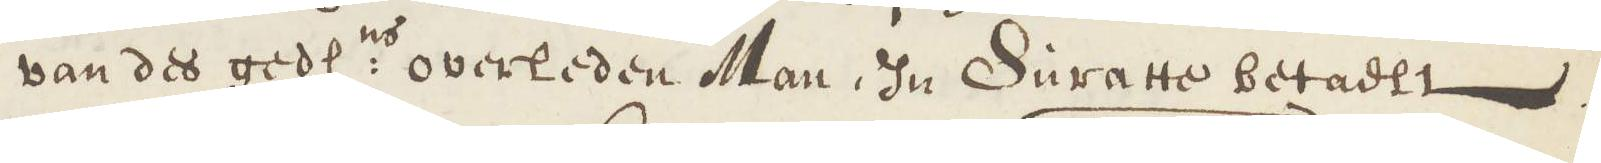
van des gedh:ns overleden Man, In Suratte betaelt
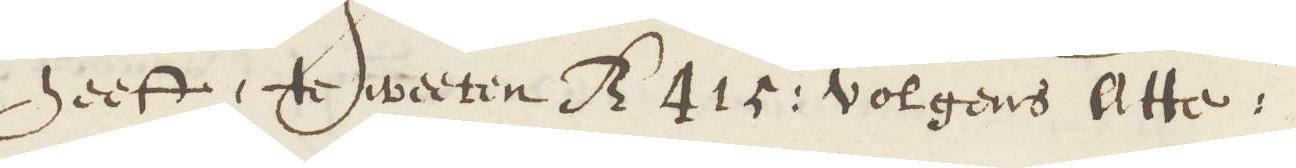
heeft, te weeten R415: volgens atte:
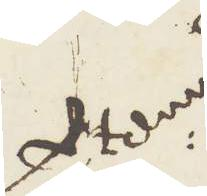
verte:
